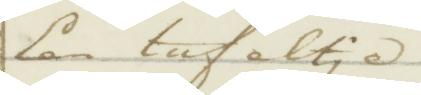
Een tafeltje
